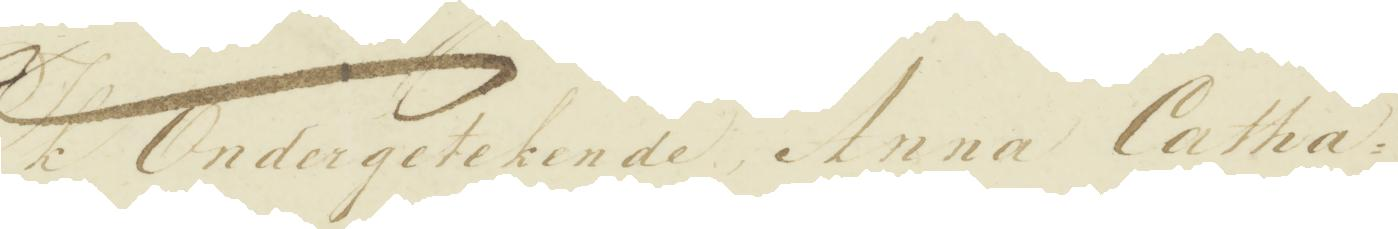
Jk Ondergetekende, Anna Catha=
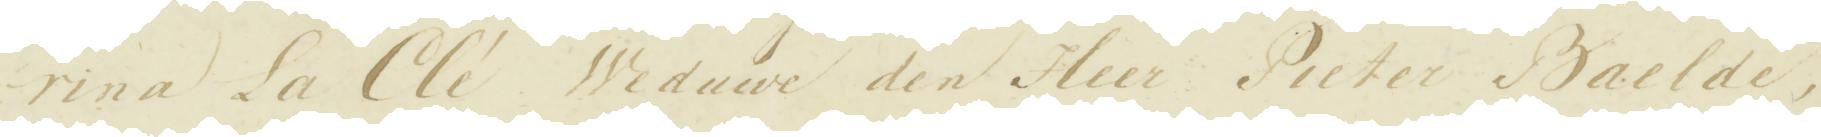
=rina La Clé Weduwe den Heer Pieter Baelde,
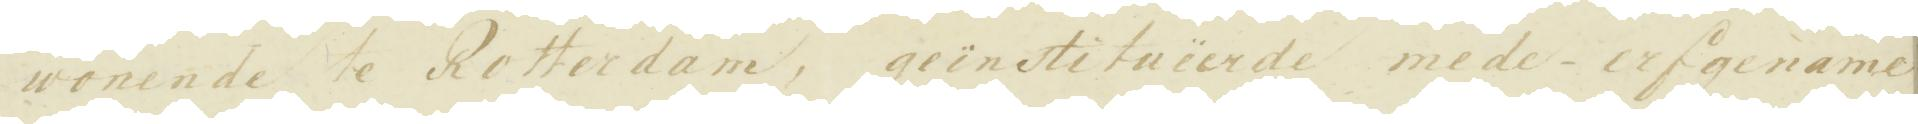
wonende te Rotterdam, geïnstituëerde mede-erfgename
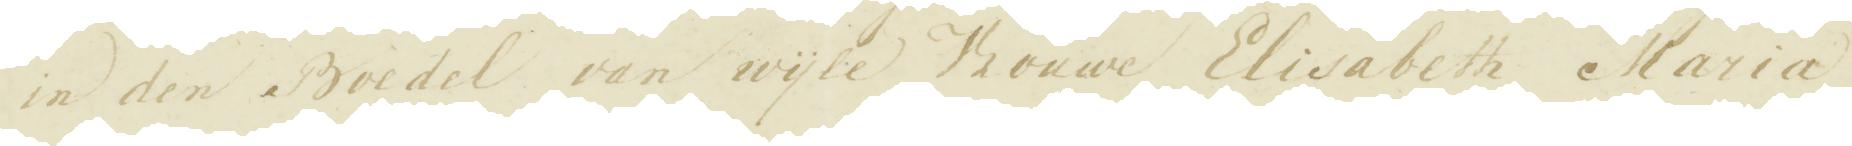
in den Boedel van wijle Vrouwe Elisabeth Maria
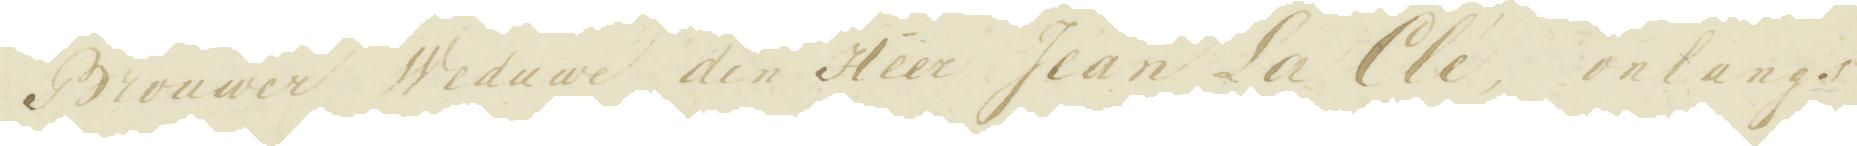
Brouwer Weduwe den Heer Jean La Clé, onlangs
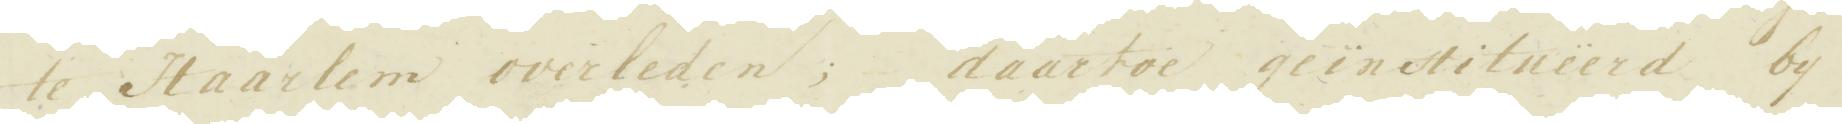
te Haarlem overleden; daartoe geïnstituëerd by
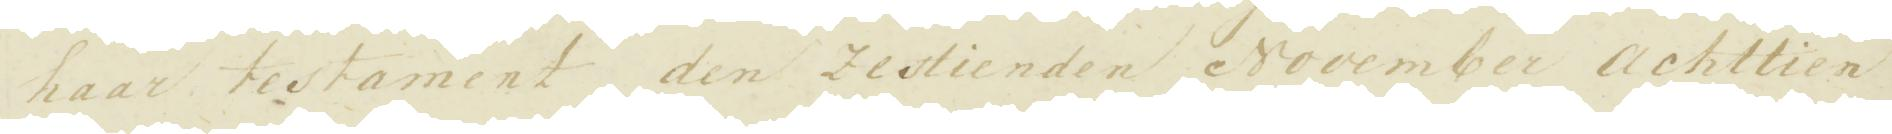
haar testament den zestienden November achttien
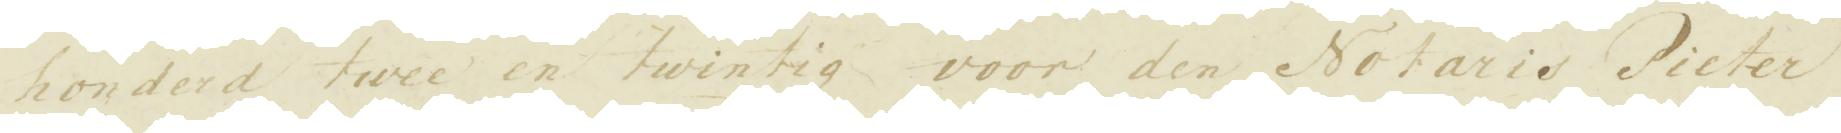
honderd twee en twintig voor den Notaris Pieter
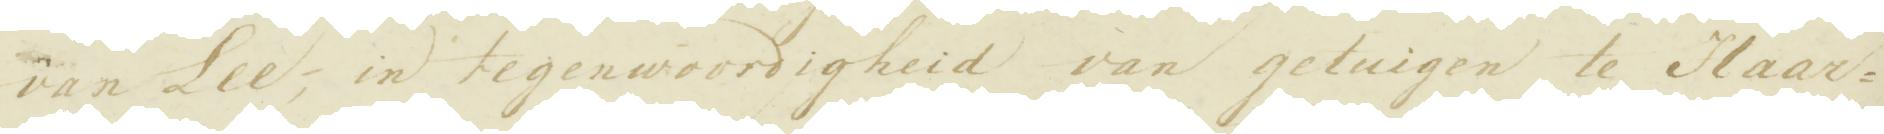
van Lee; in tegenwoordigheid van getuigen te Haar=
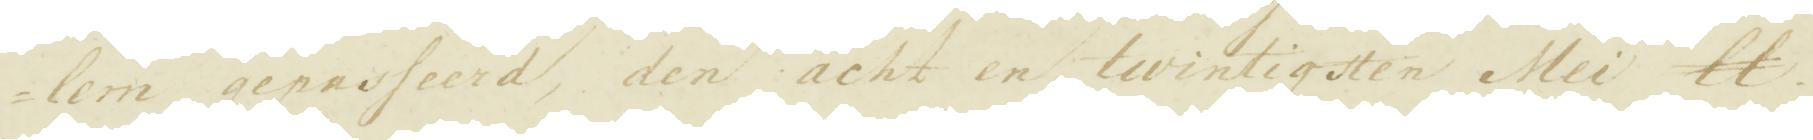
=lem gepasseerd, den acht en twintigsten Mei ll
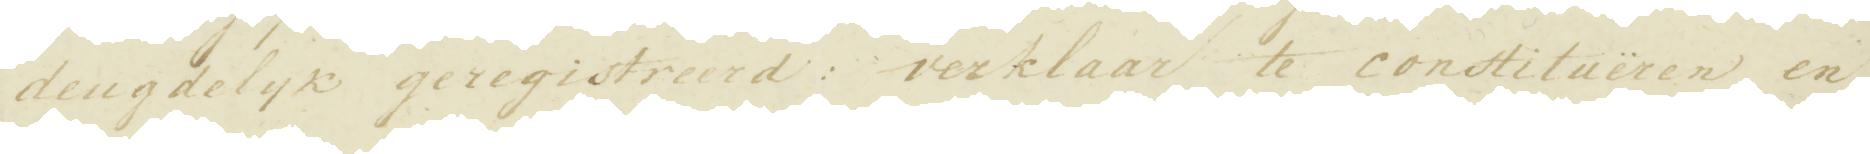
deugdelyk geregistreerd: verklaar te constituëren en
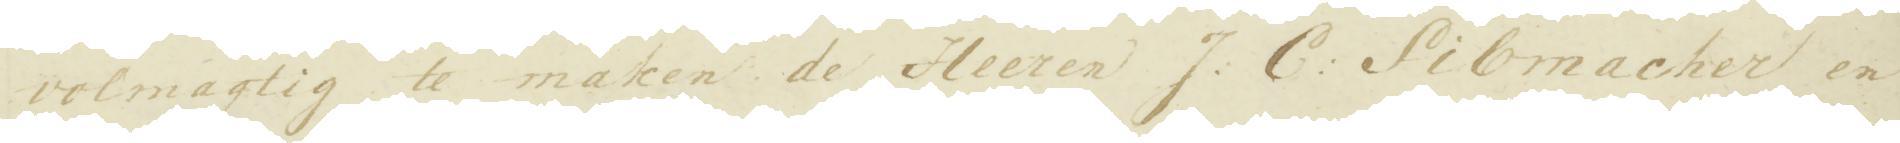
volmagtig te maken de Heeren J: C: Sibmacher en
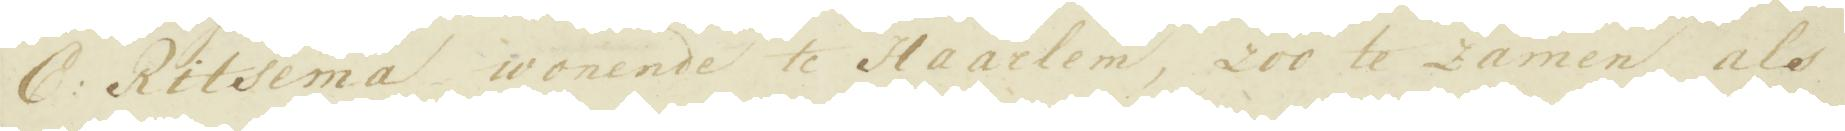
C: Ritsema wonende te Haarlem, zoo te zamen als
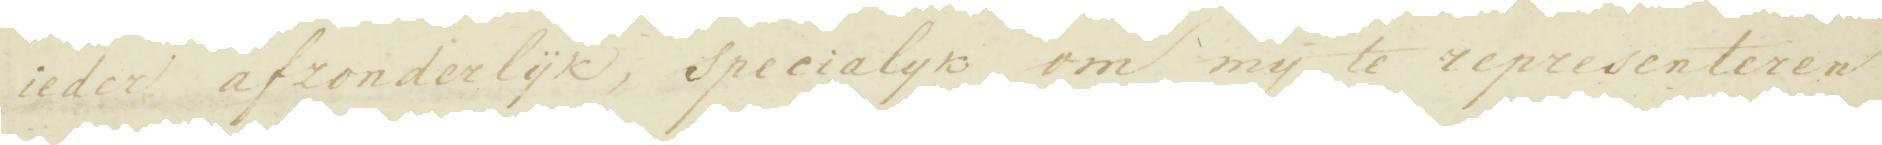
ieder afzonderlijk, specialyk om mij te representeren
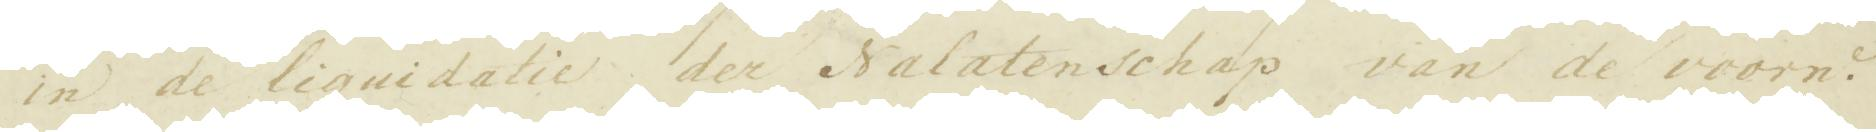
in de liquidatie der Nalatenschap van de voorn.e
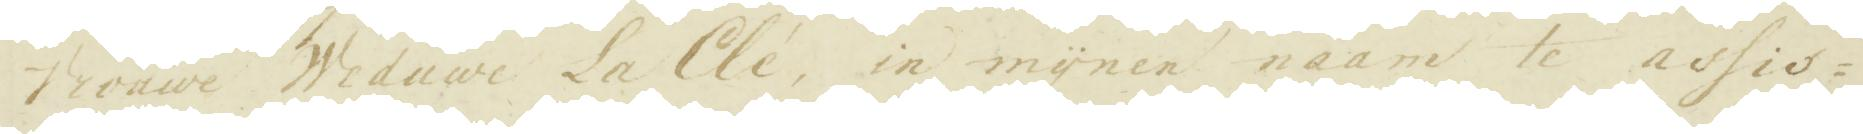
Vrouwe Weduwe La Clé, in mijnen naam te assis=
